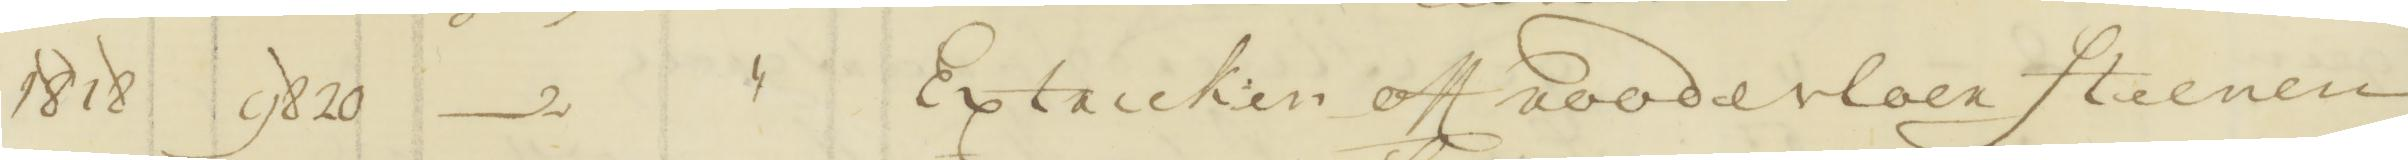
1818 9820 _o „ Extricken off roode vloer steenen
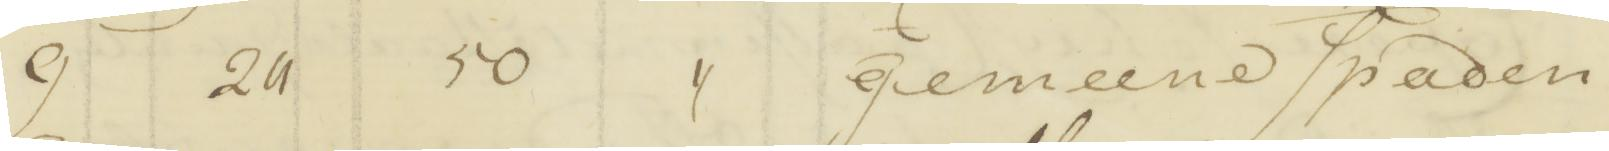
9 24 50 „ gemeene spaden
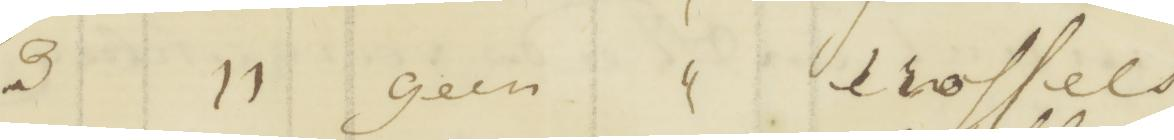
3 11 geen „ trossels
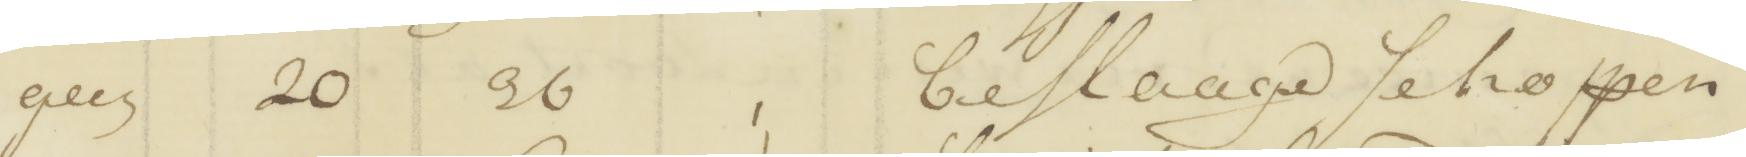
geen 20 36 , beslaage schoppen
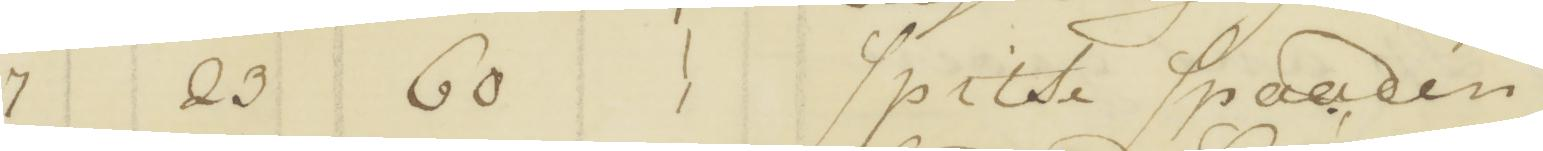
7 23 60 „ spitse spaaden
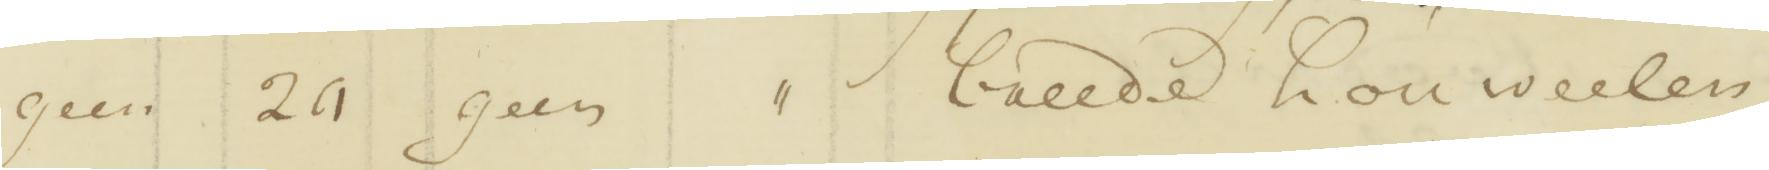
geen 24 geen „ breede houweelen
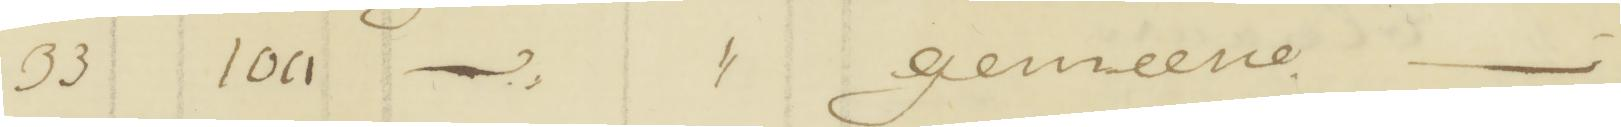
33 104 _,o gemeene _o
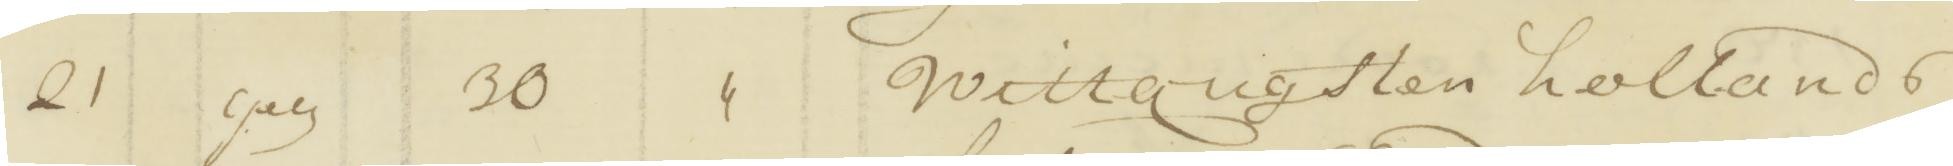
21 geen 30 „ wittqugsten hollands
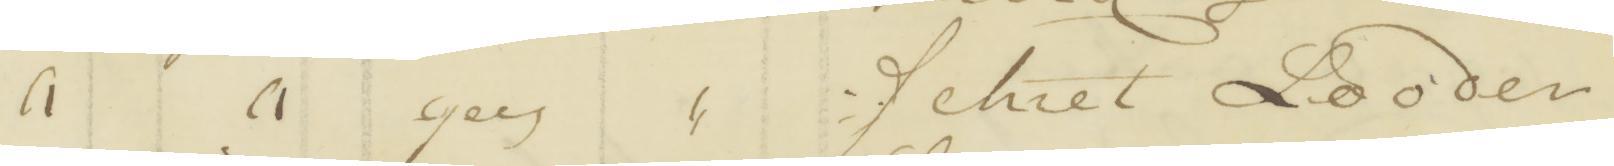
4 4 geen „ schiet Looden
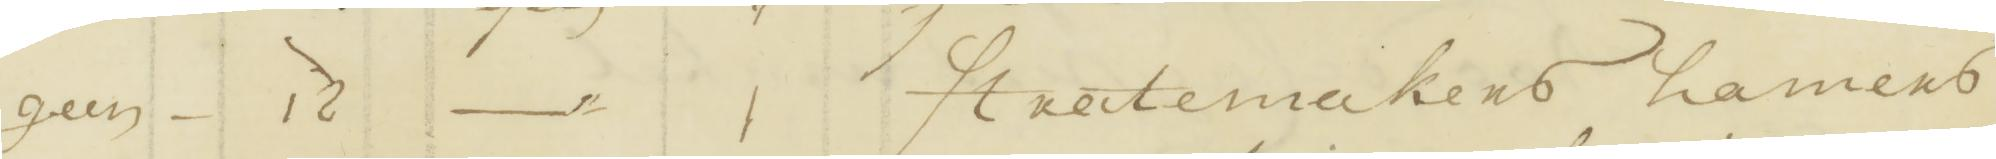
geen – 18 _„o stratemakers hamers
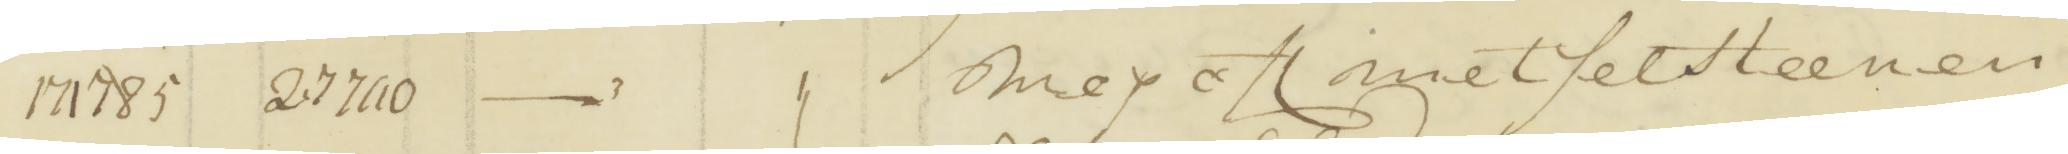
171785 27740 _o „ mop off metselsteenen
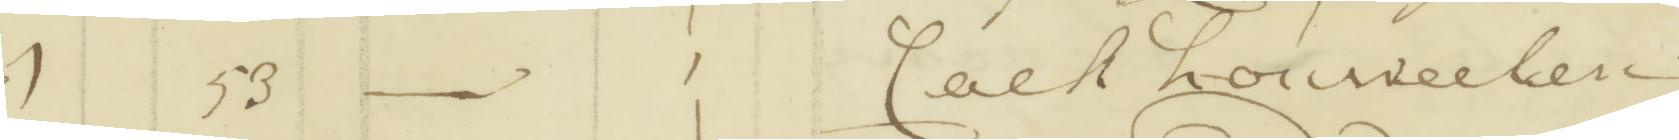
1 53 _o Caek houweelen
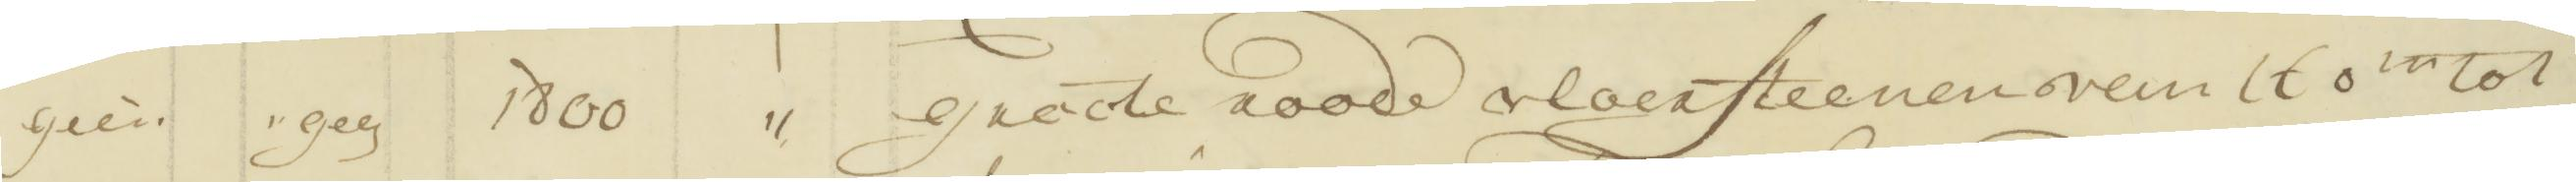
geen „geen 1800 „ groote roode vloersteenen van 160m tot
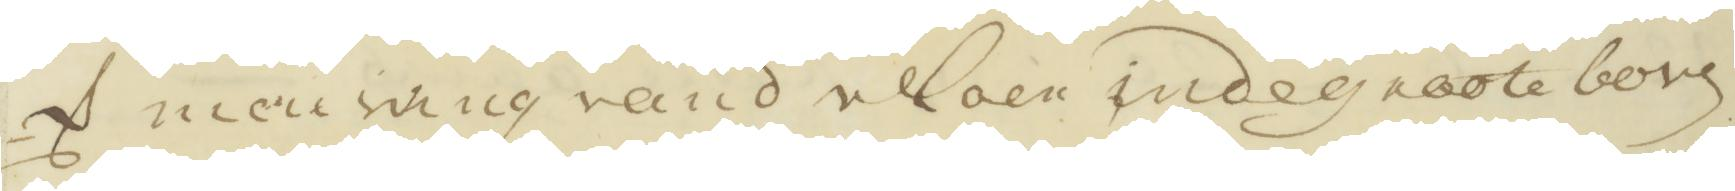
vernieuwing van d reloer inde groote boven
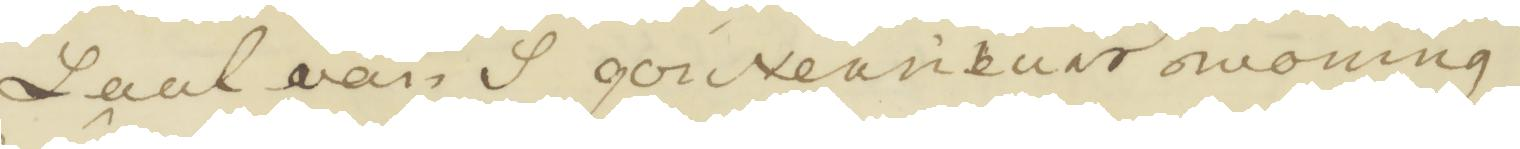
zaal van 's gouverneurs woning
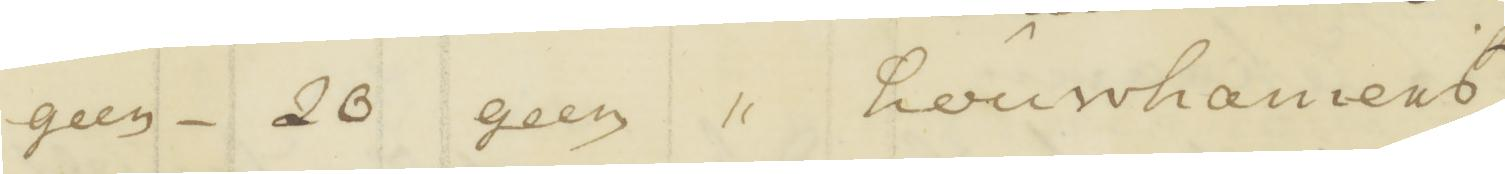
geen – 20 geen „ houwhamers
